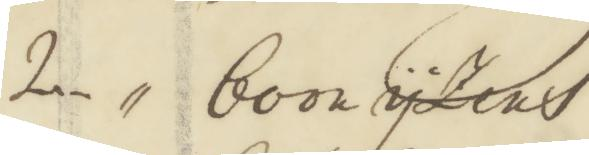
2.-. „ boor ijzers
